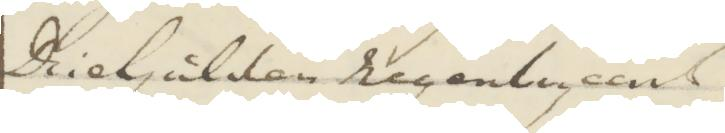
Drie Gulden negentig cent
